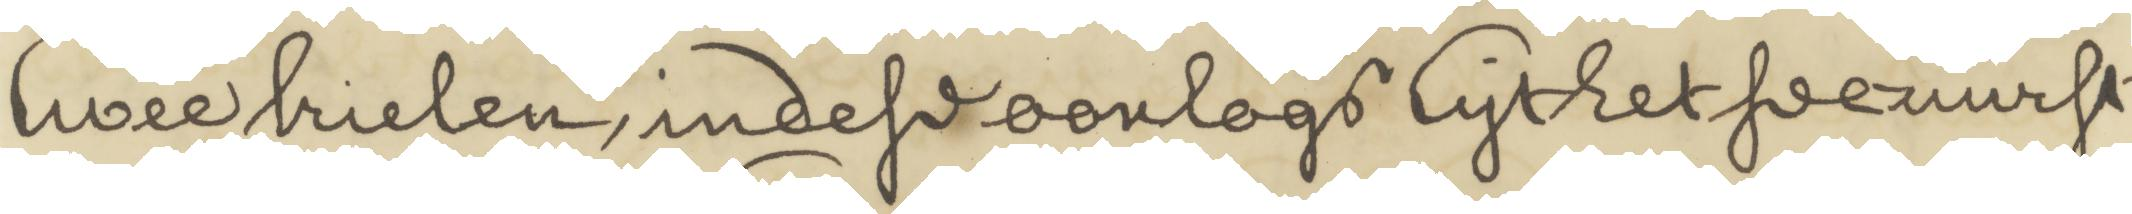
twee kielen, in dese oorlogs tijt het secuurst
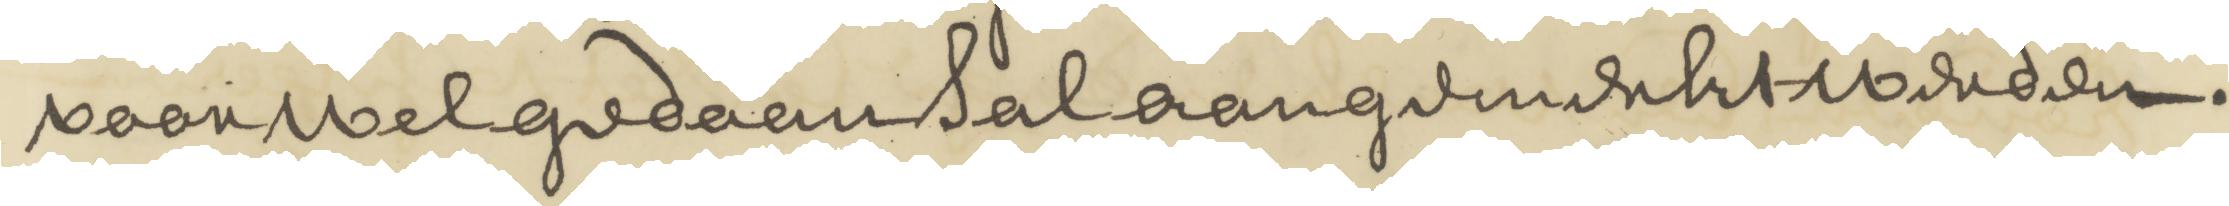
voor wel gedaan Sal aangemerkt werden.
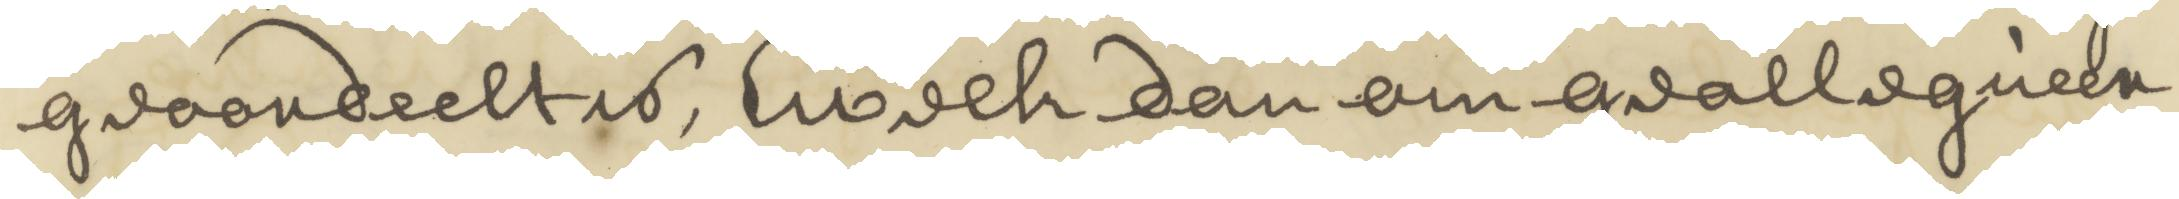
geoordeelt is, twelk dan om geallegueer
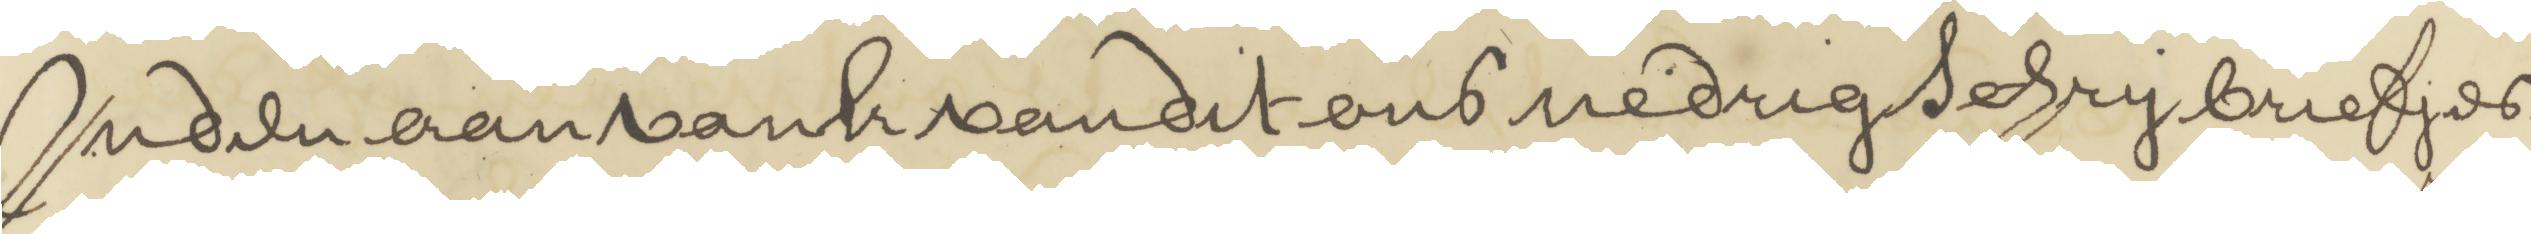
Jn den aan vank van dit ons nedrig Schrij briefjes
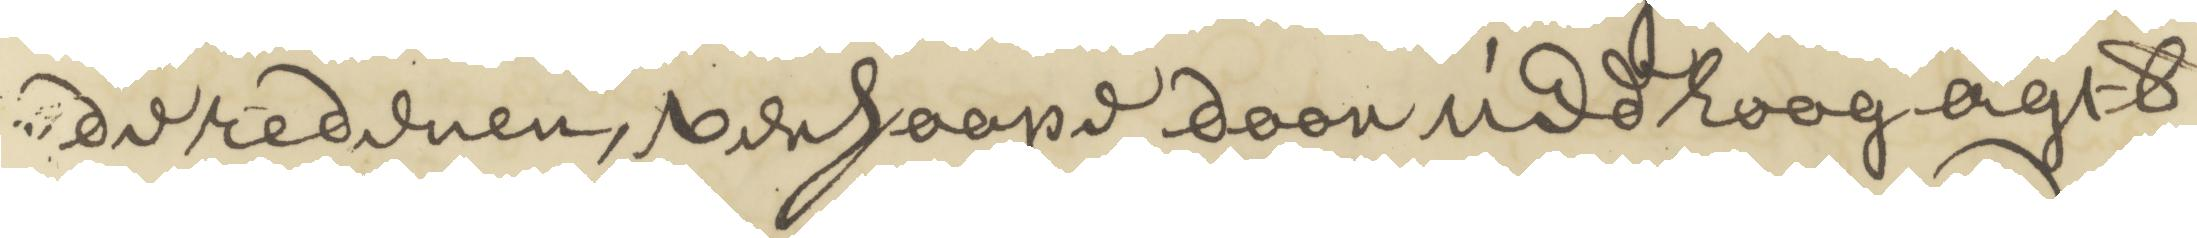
„de redenen, verhoope door uEd:' hoog agtb
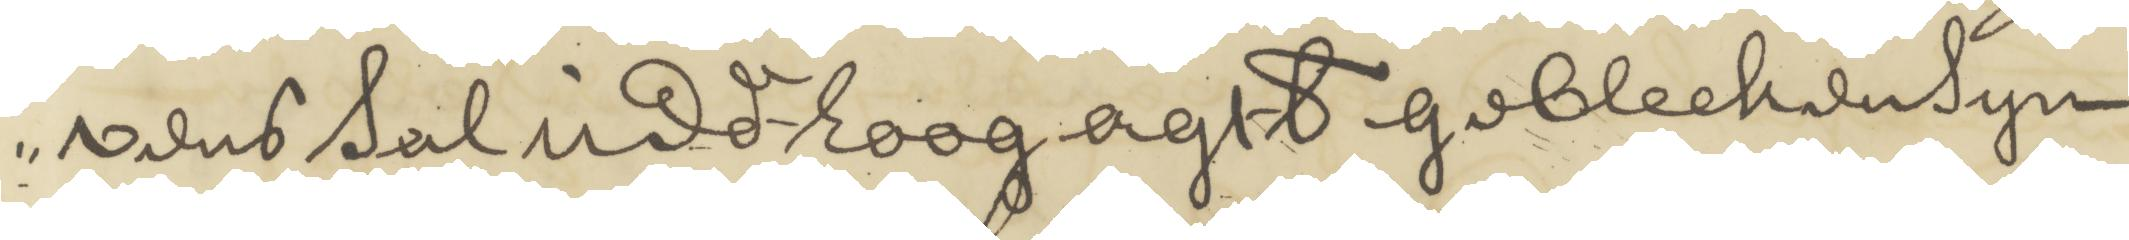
„vens Sal uEd-e hoog agtb gebleeken sijn
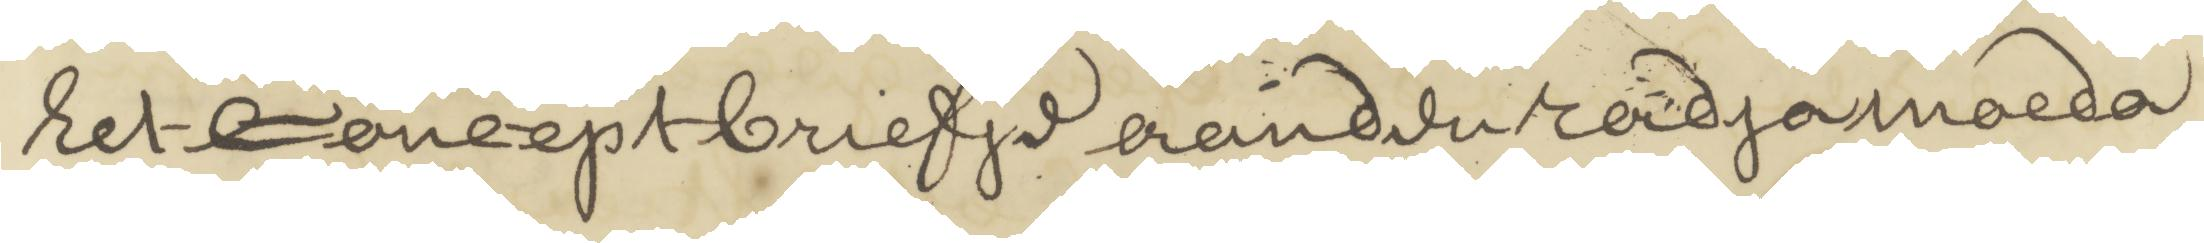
het Concept briefje aan den radja moeda
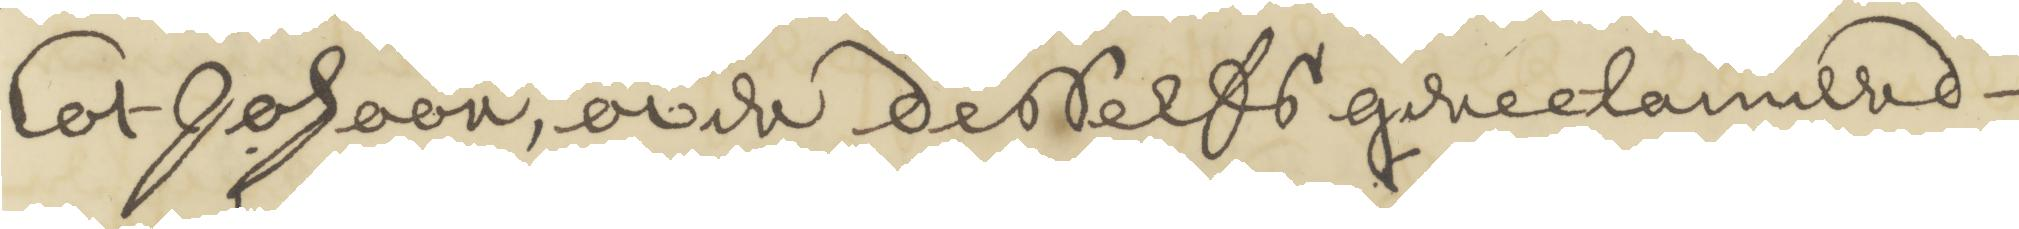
tot Johoor, over desselfs gereclameerd
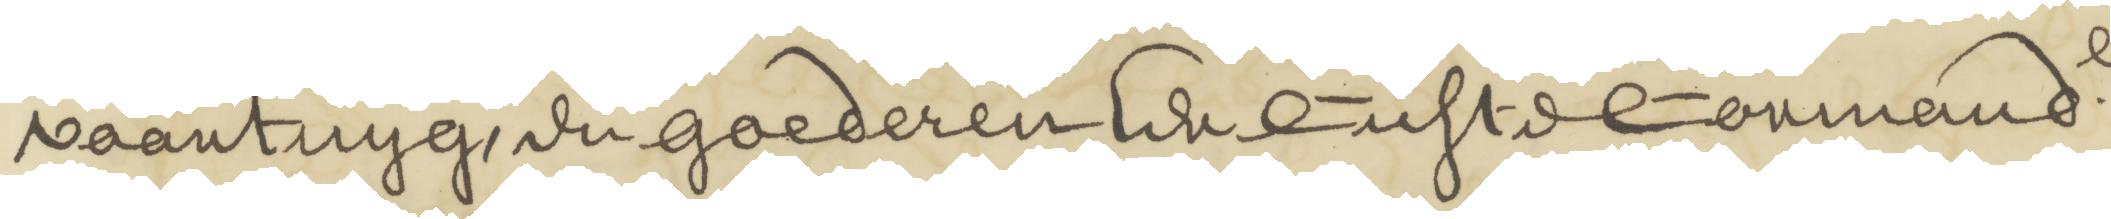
vaartuijg, en goederen ter custe Cormand:l
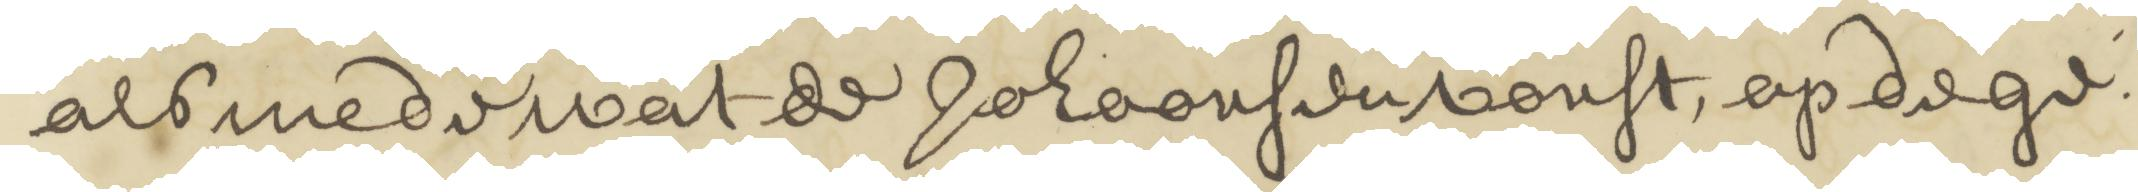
als mede wat de Johoorsen vorst, op de ge
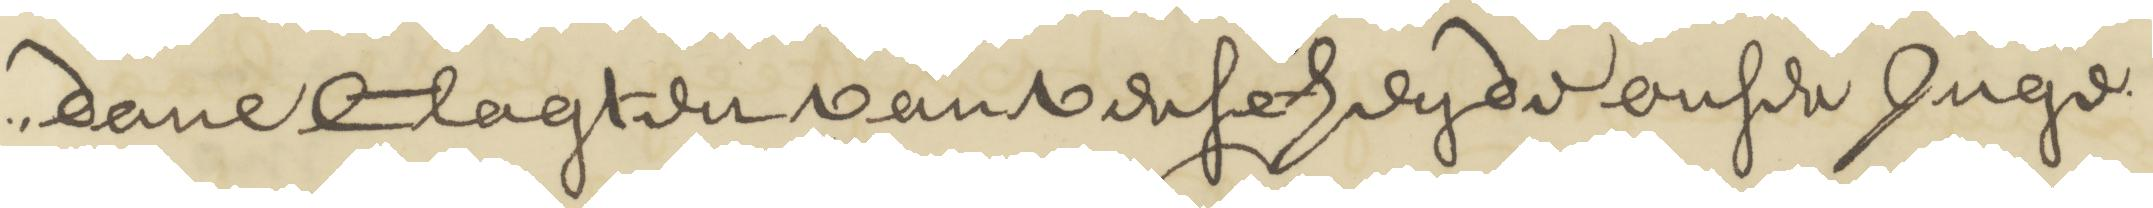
„dane Clagten van verscheyde onser Jnge
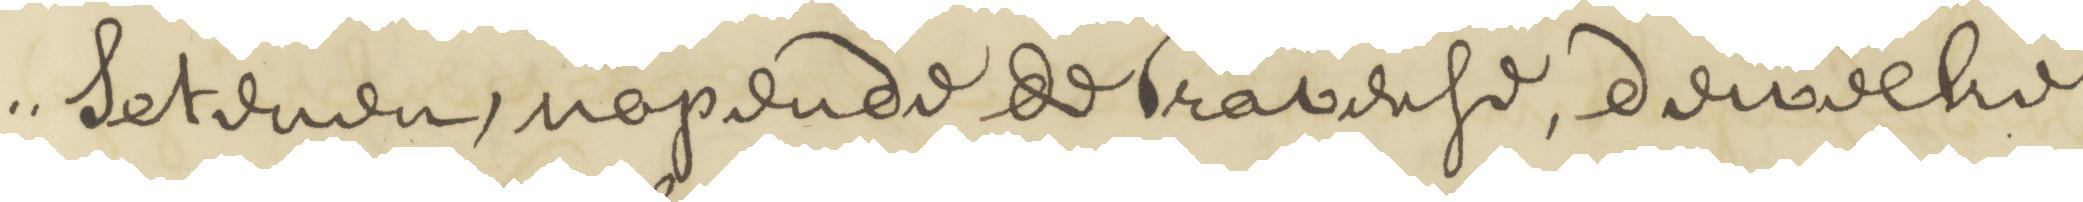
„ Setenen, nopende de traverse, dewelke
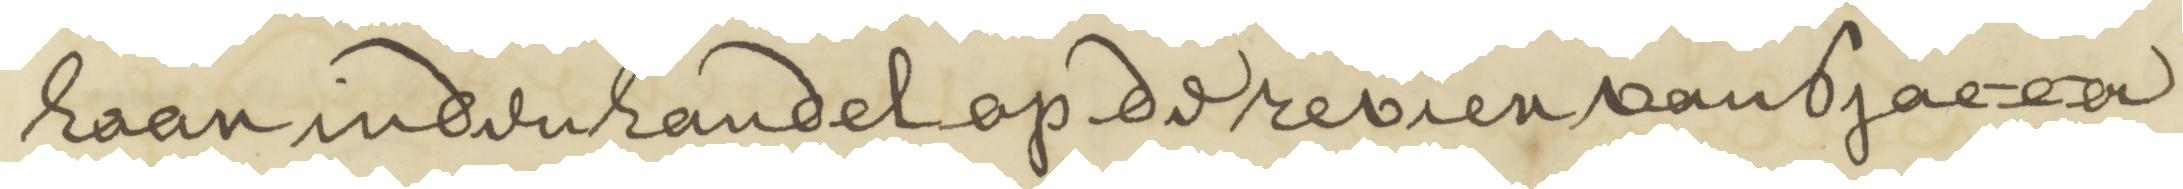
haar in den handel op de revier vans jacca
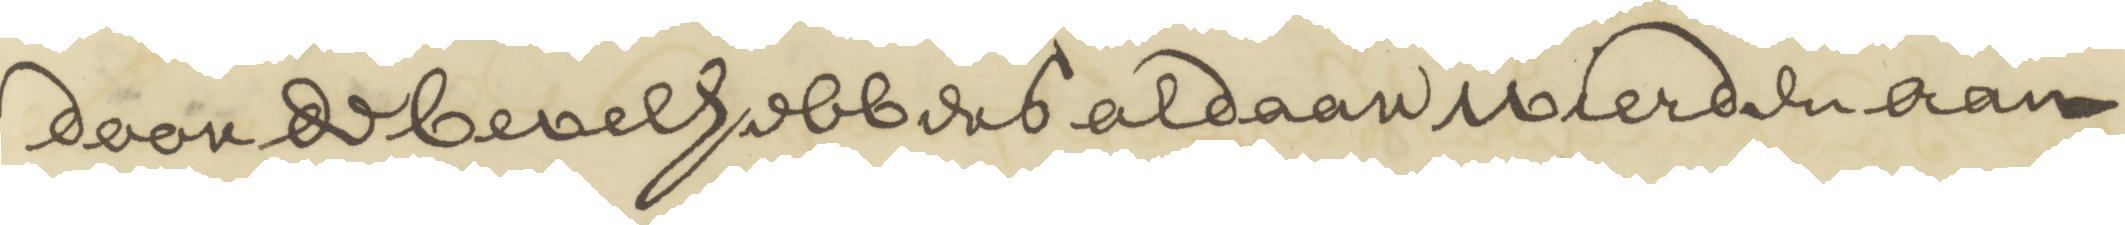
door de bevelhebbers aldaar wierd en aan
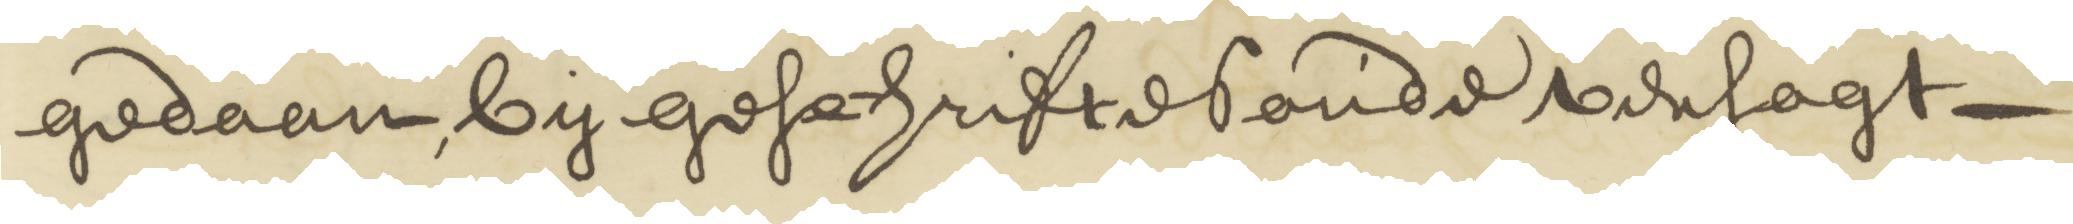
gedaan, bij geschrifte soude versogt —
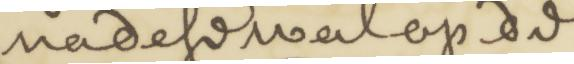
na dese wal op de
